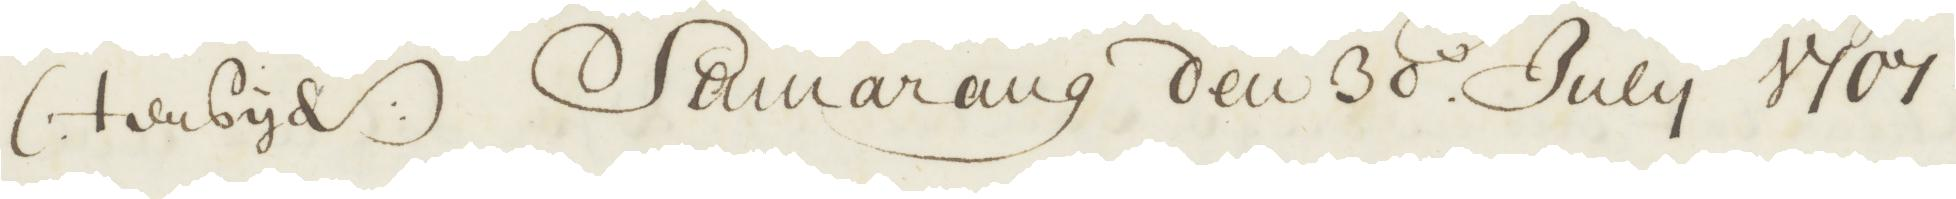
(:tersijd:) Samarang den 30.e Julij 1707.
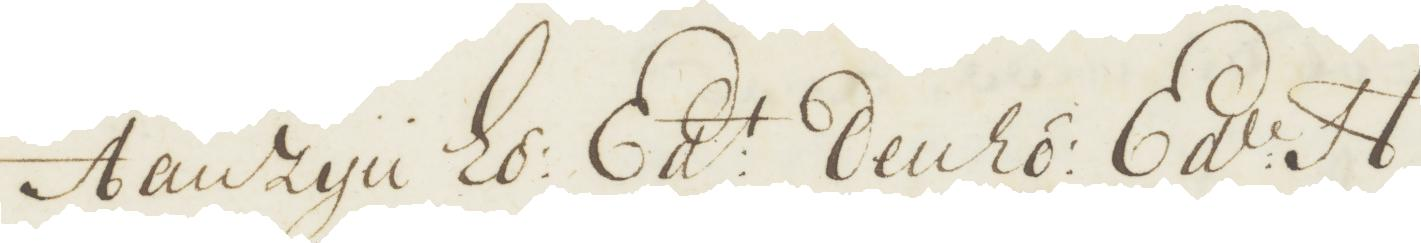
Aan zijn Ed: Ed:t den ho: Ed:le H:re
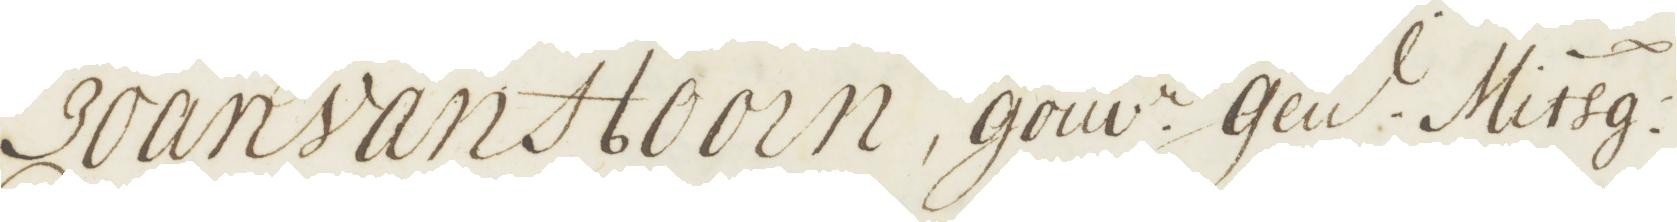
Ioan van Hoorn, gouv.r gen.l Mitsg:
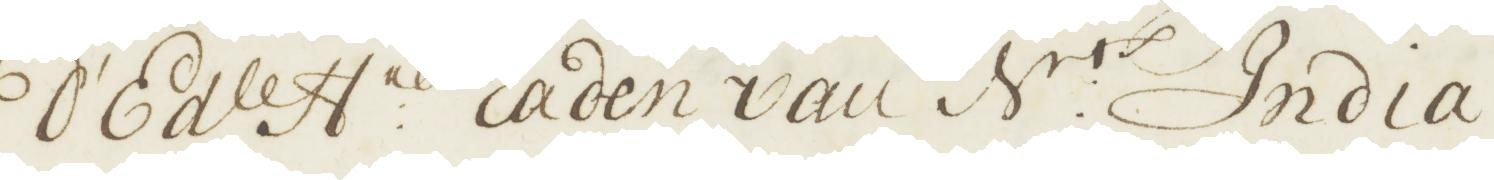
d’ Edle H:ren raden van N:rts India
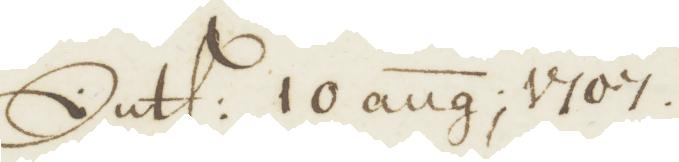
Ontf: 10 aug; 1707.
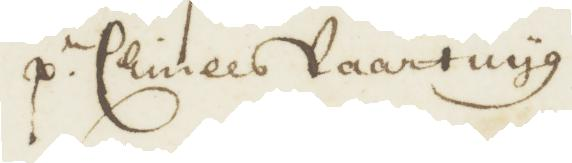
p.n Chinees vaartuijg
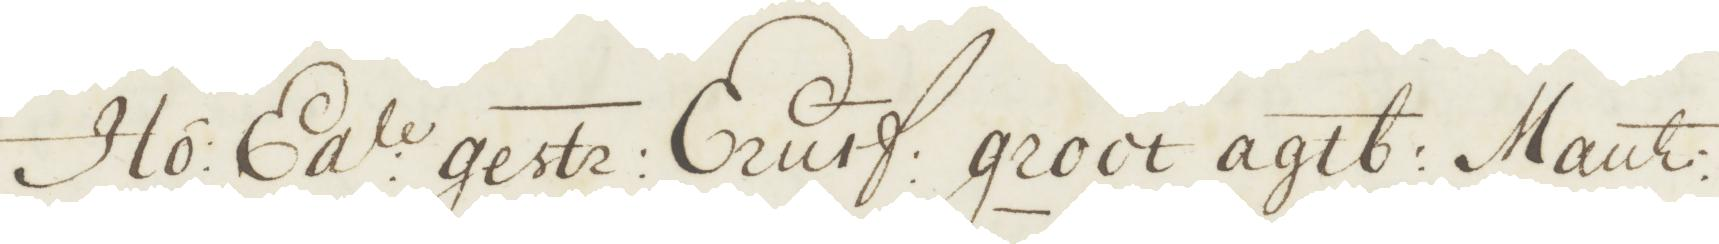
Ho: Ed:le gestr: Erntf: groot agtb: Manh:
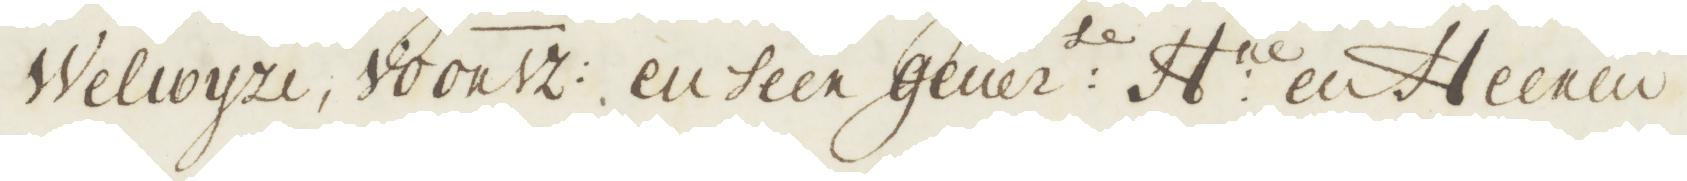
welwijze, voorsz: en seer gener:se H:re en Heeren
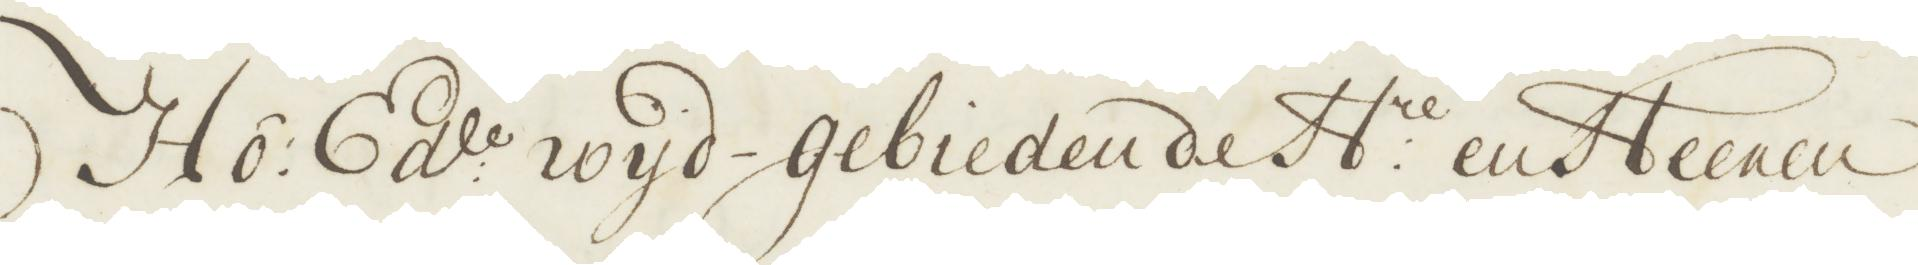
Ho: Ed:le wijd-gebieden de H:re en Heeren
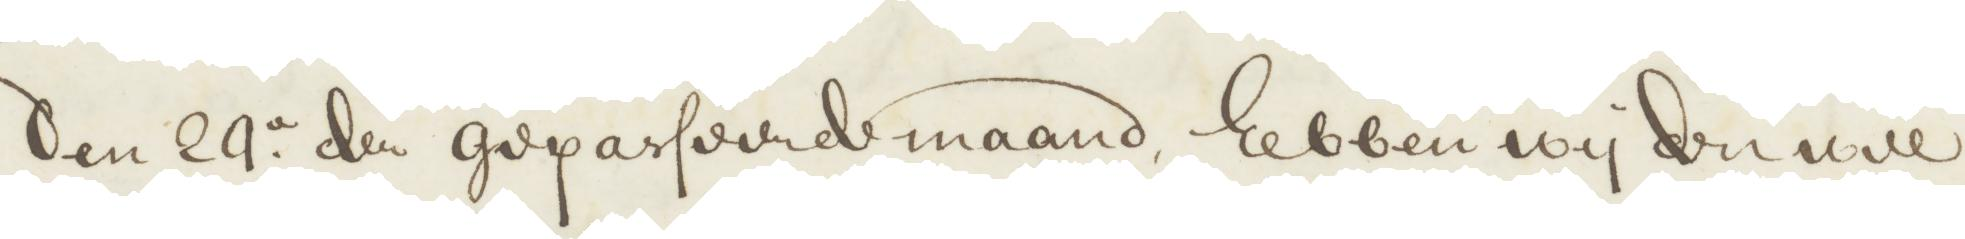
den 29.e der gepasseerde maand, hebben wij den wel
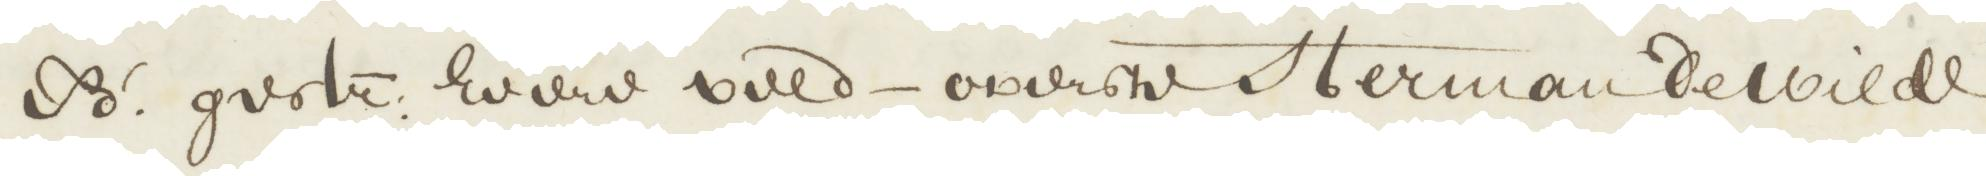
Es'. gestr: heere veld-overste Herman dewilde
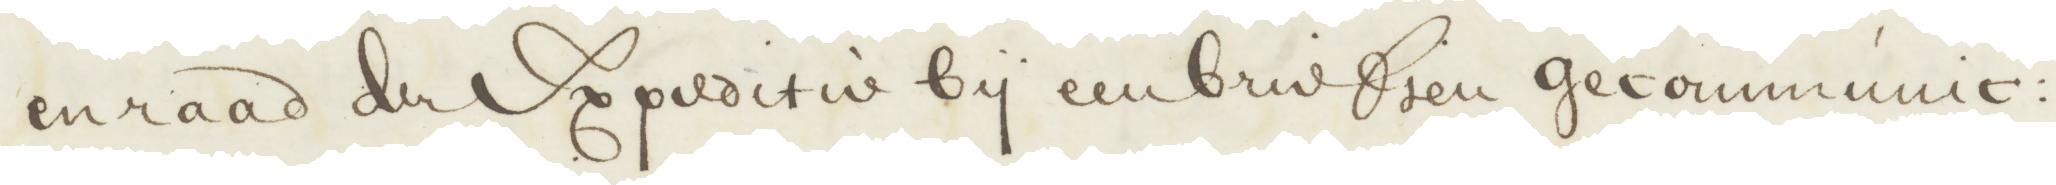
en raad der Expeditie bij een briefjen gecommunic:
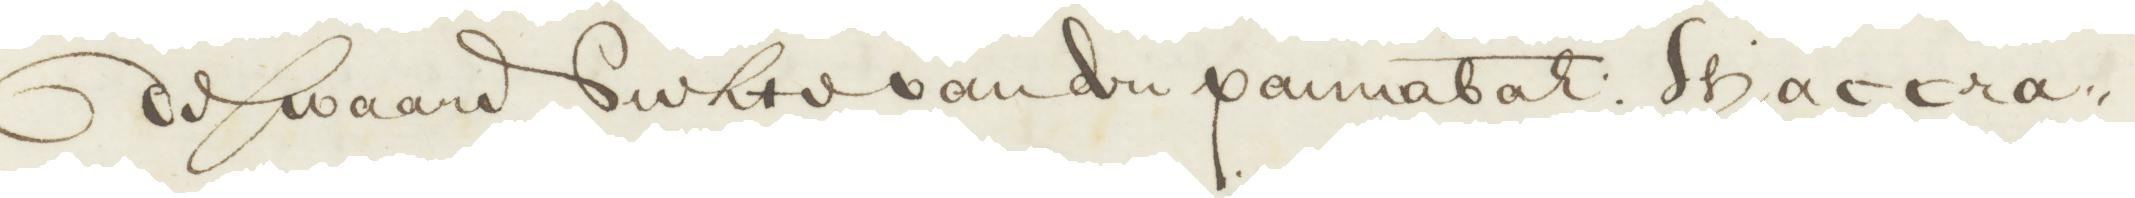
de swaare siekte van den pannabah: tsjaccra„
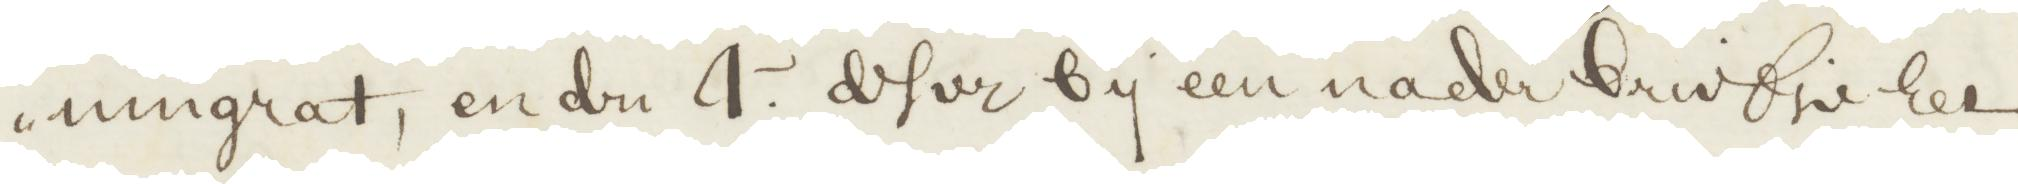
„ningrat, en den 4. en deser bij een nader briefje het
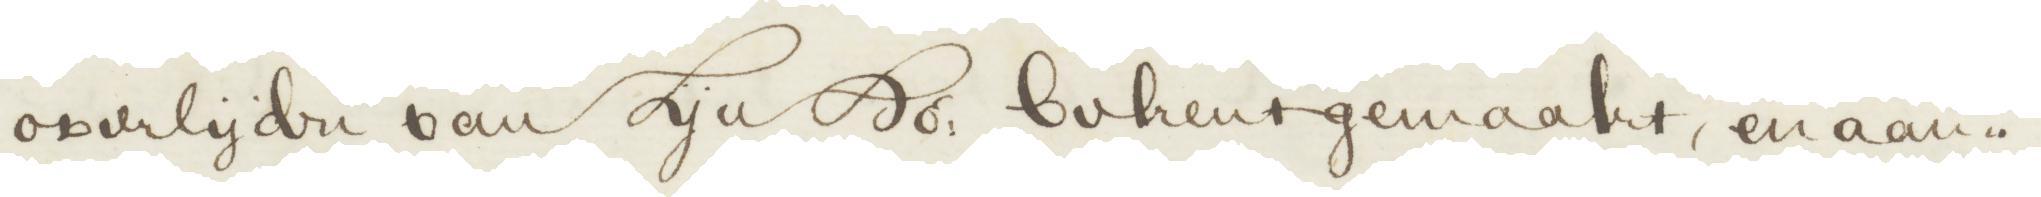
overlijden van sijn Ho: bekent gemaakt, en aan„
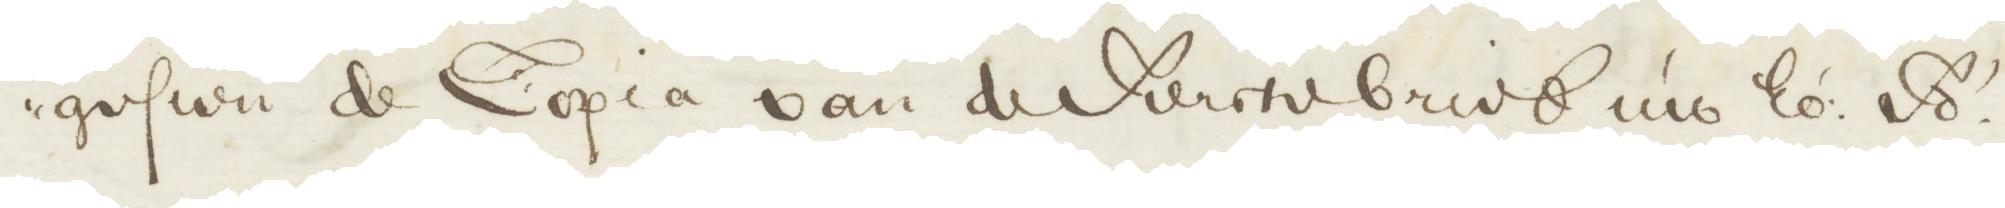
„gesien de Copia van de Eerste brief uw ho: Ed.
